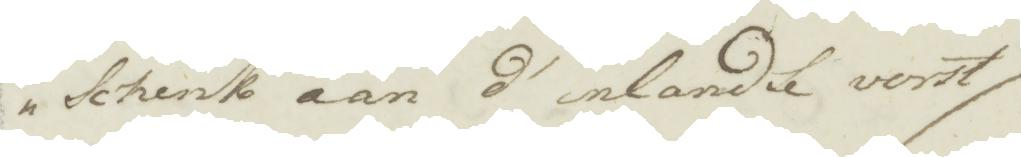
„schenk aan d’ inlandse vorst
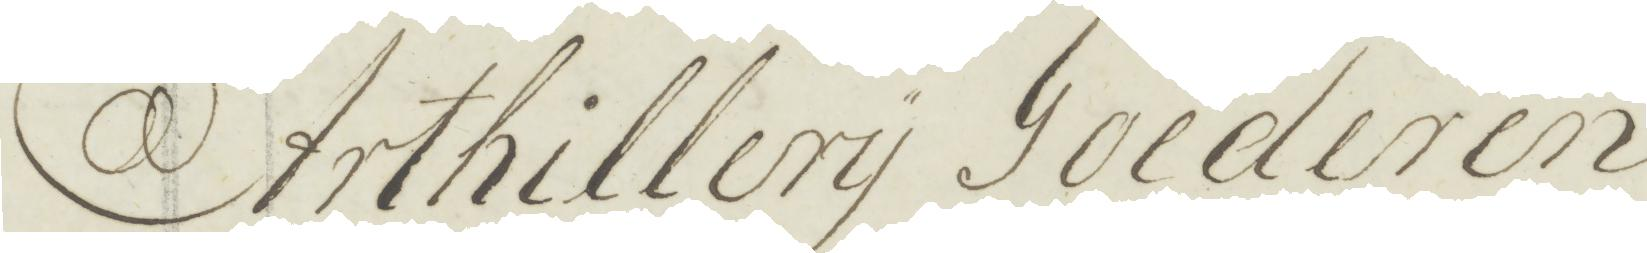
Arthillerij Goederen
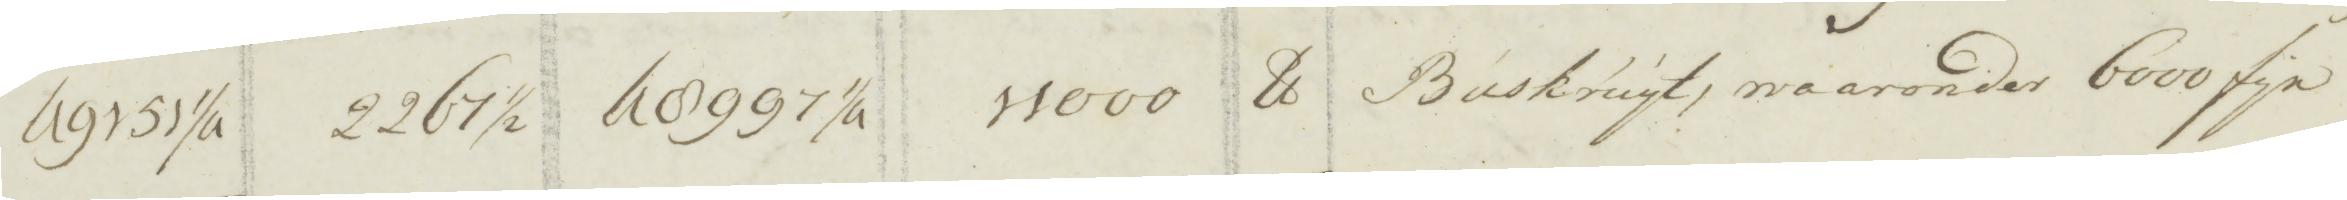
49151¼ 2267½ 48997¼ 11000 lb Buskruijt, waar onder 6000 fijn
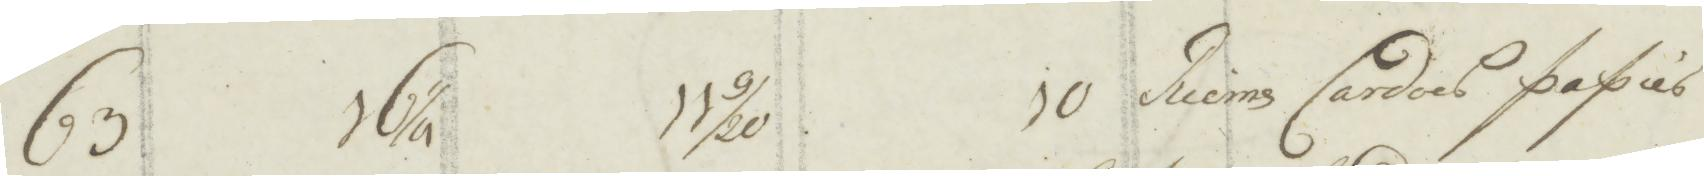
63 16¼ 11 9/20 10 Riemen Cardoes papier
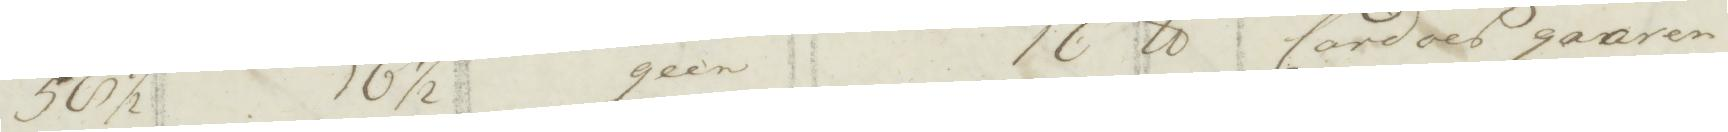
58½ 16½ geen 16 lb Cardoes gaaren
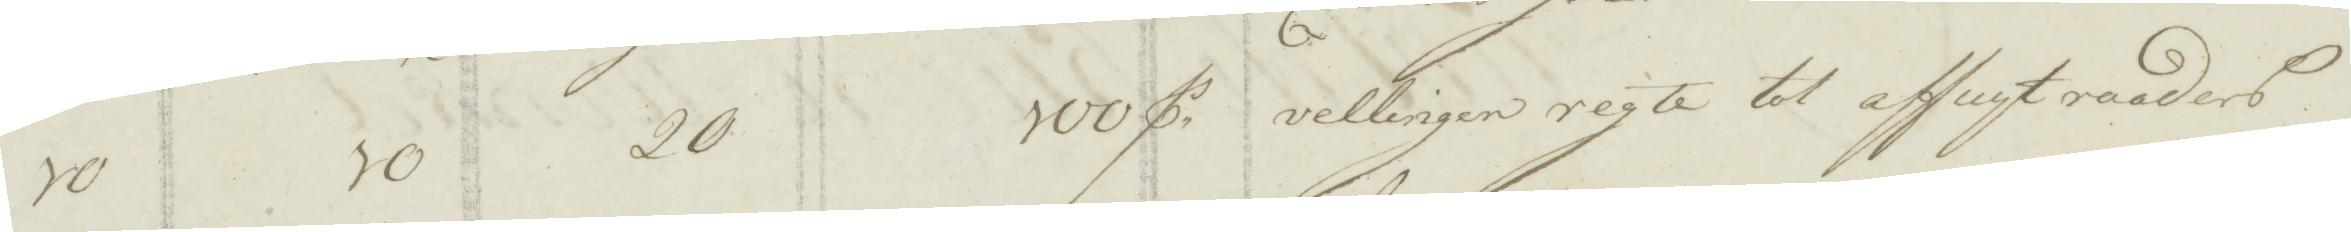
10 10 20 100 p„s vellingen regte tot affuyt raaders
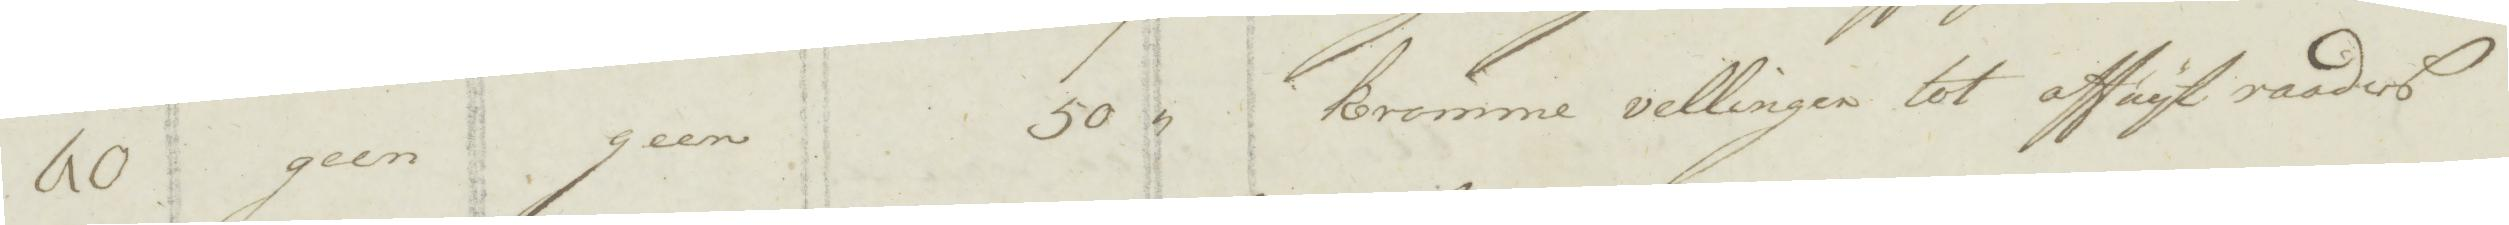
40 geen geen 50 „ kromme vellingen tot affuijt raaders
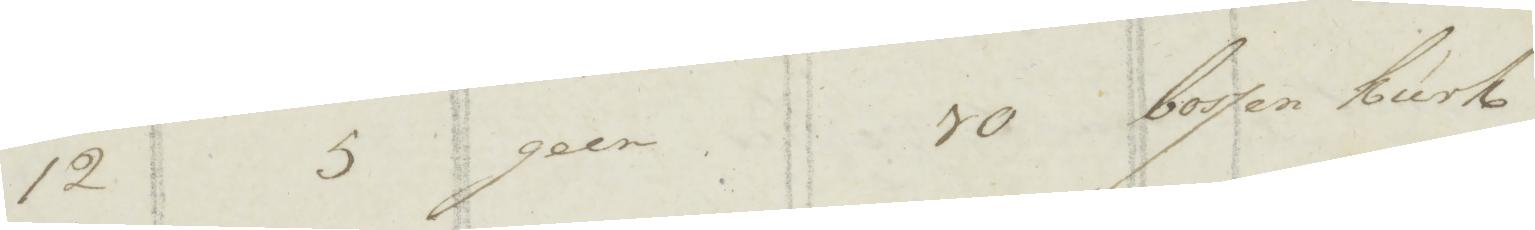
12 5 geen 10 bossen kurk
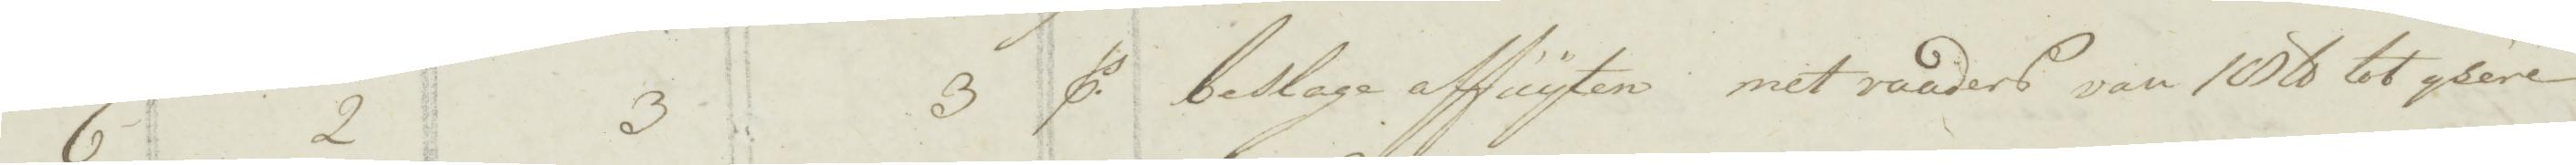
6 2 3 3 p.s beslage affuijten met raaders van 18 lb tot ysere
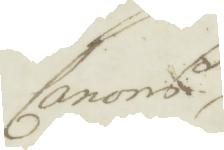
Canons.
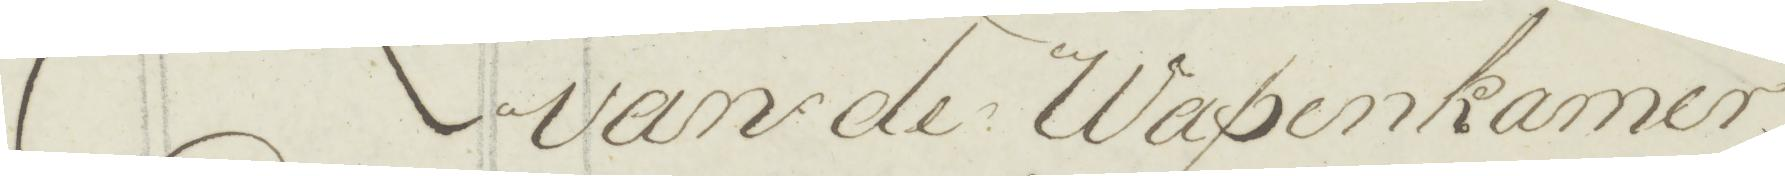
Van de Wapenkamer
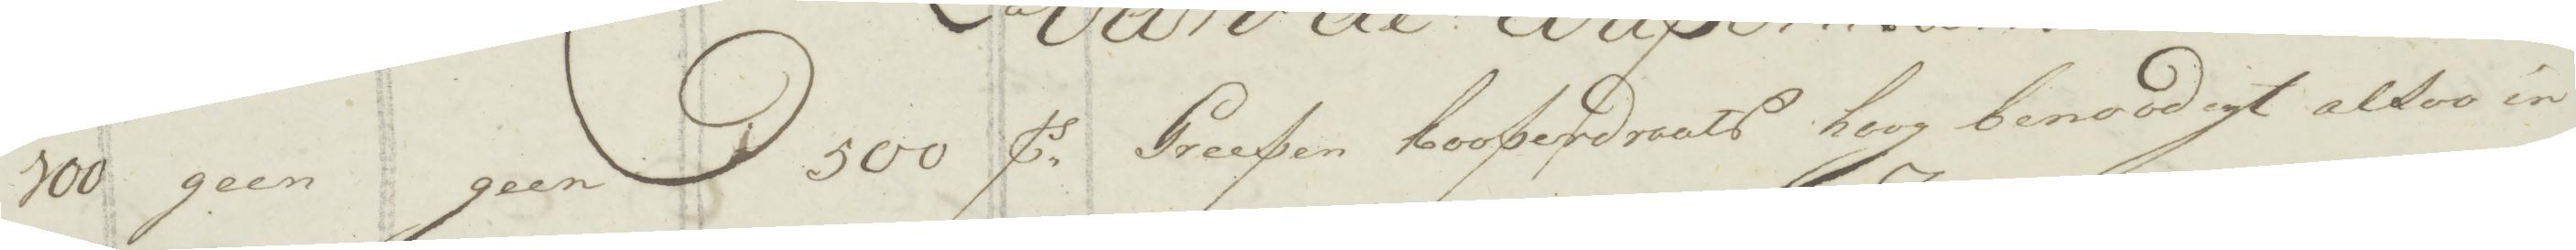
100 geen geen 500 p„s Greepen kooperdraats hoog benoodigt alsoo in
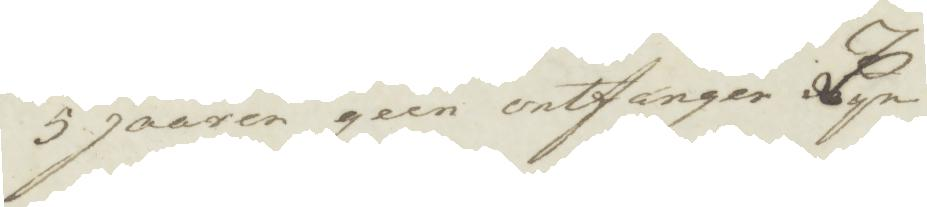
5 jaaren geen ontfangen zyn
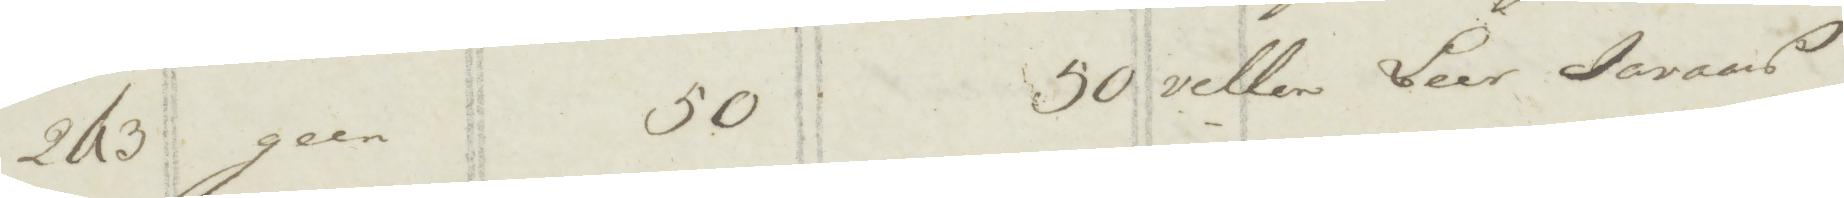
243 geen 50 50 vellen Leer Iavaans
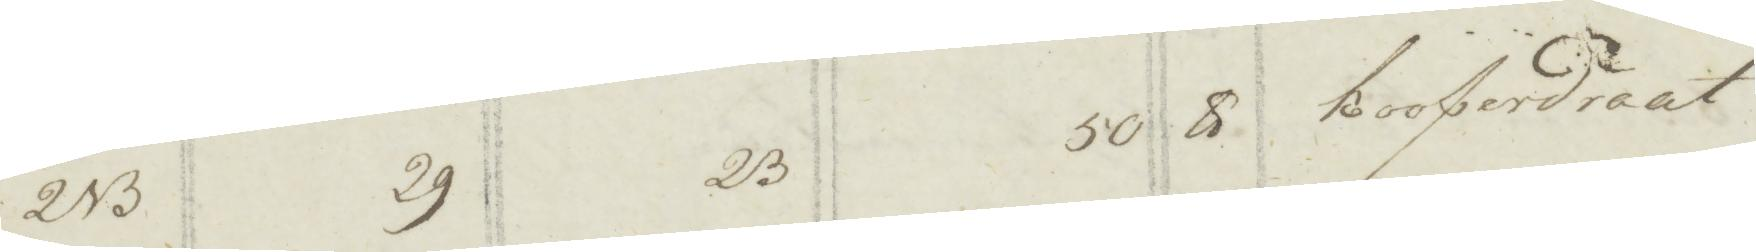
213 29 23 50 lb kooperdraat
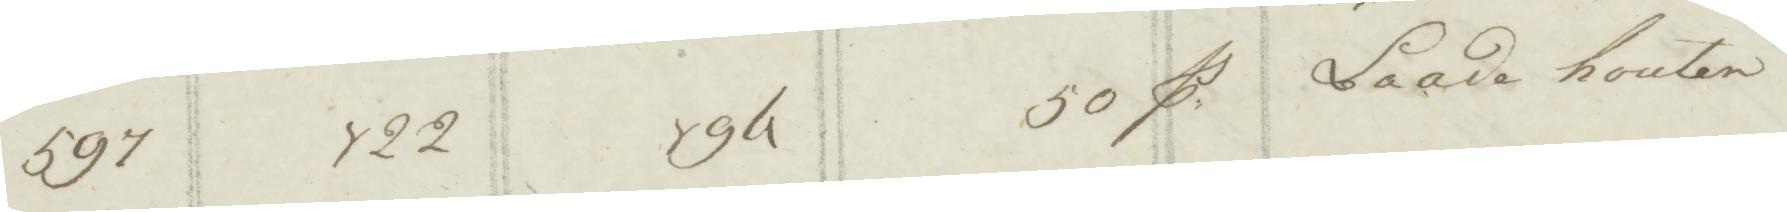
597 122 194 50 p:s Laade houten
